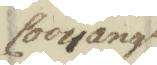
Cooijangs
